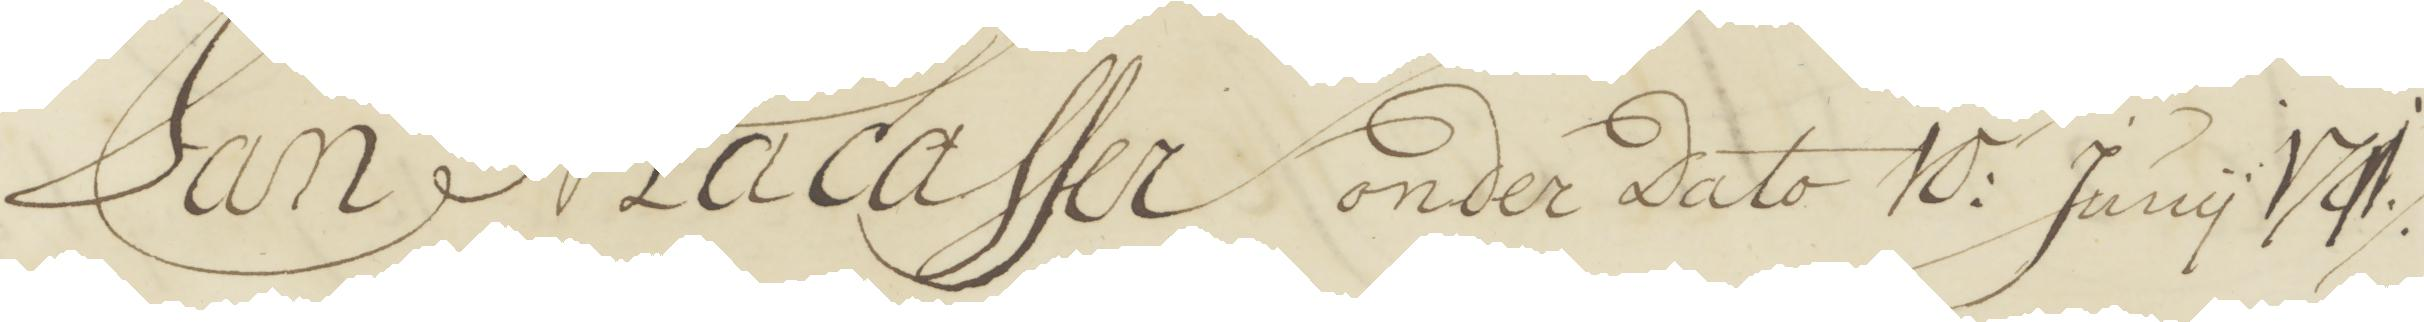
Van Macasser onder Dato 10:' Junij 1741./.
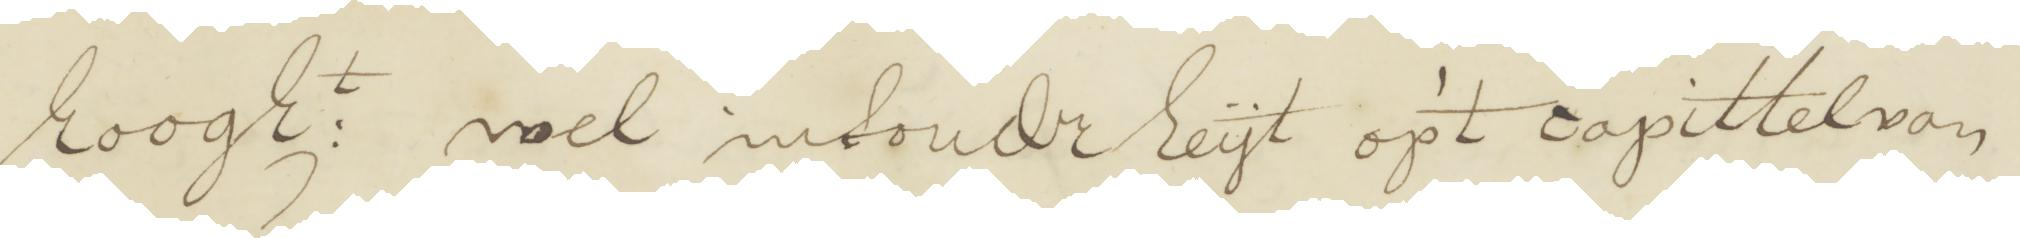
hoogh:t wel insonder heijt op ’t capittel van
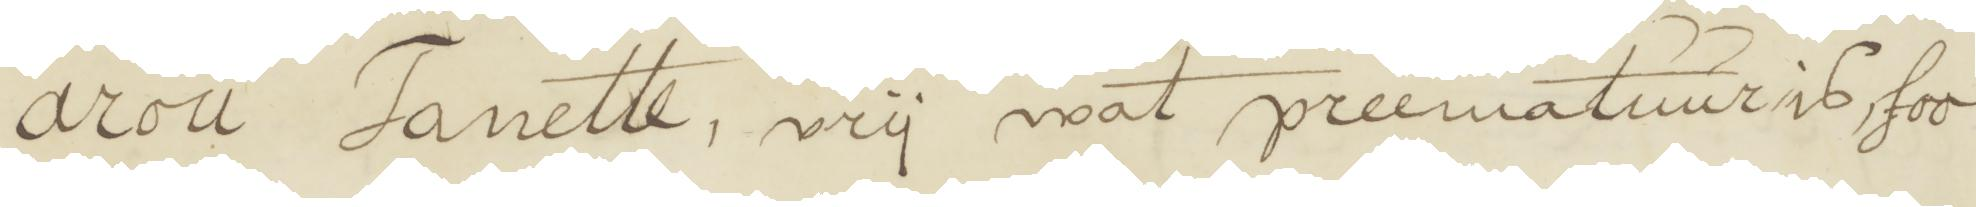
arou Tanette, vrij wat preematuur is, soo
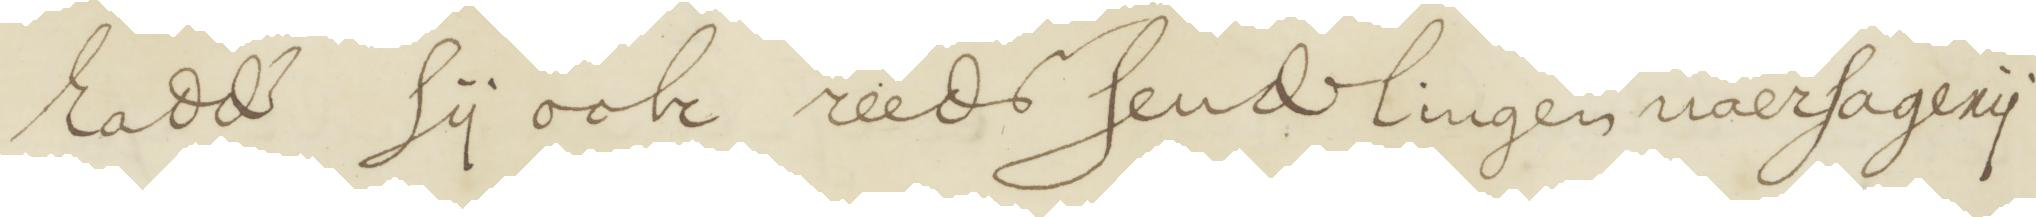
hadde sij ook reeds sendelingen naersagerij
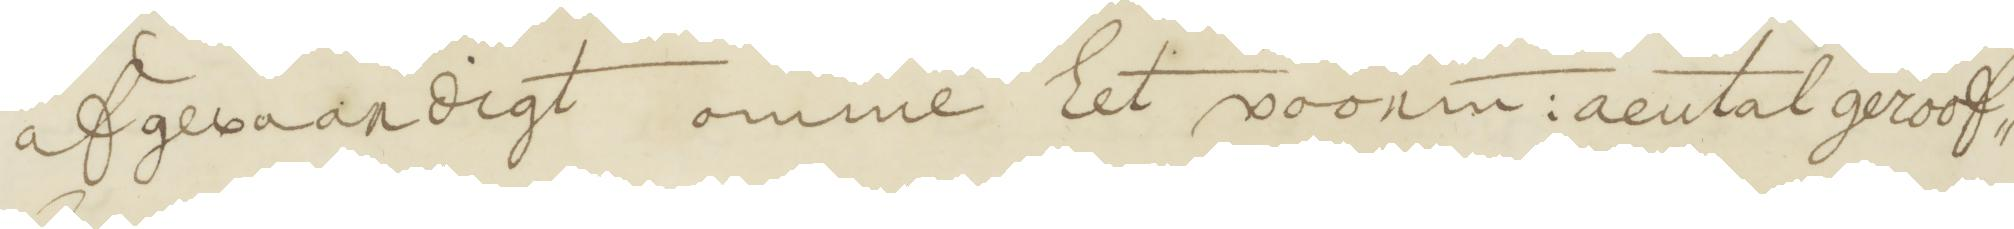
afgevaardigt omme het voorm: aental geroof„
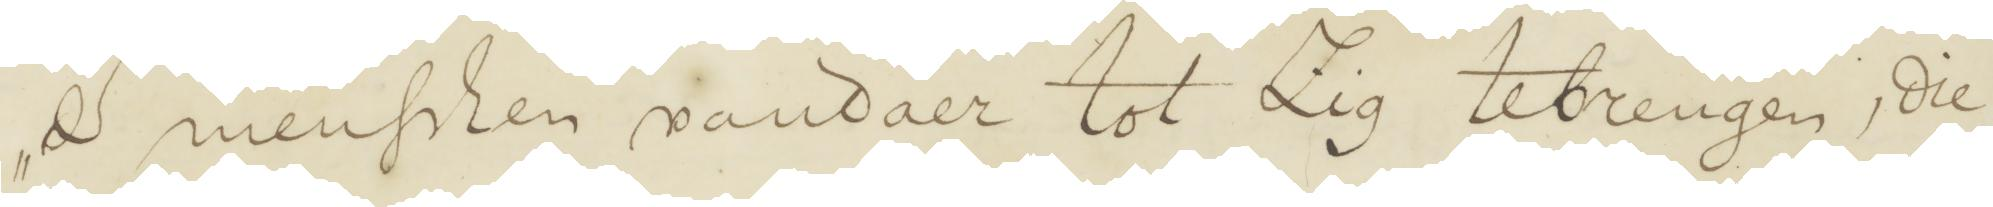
„de menschen vandaer tot zig tebrengen, die
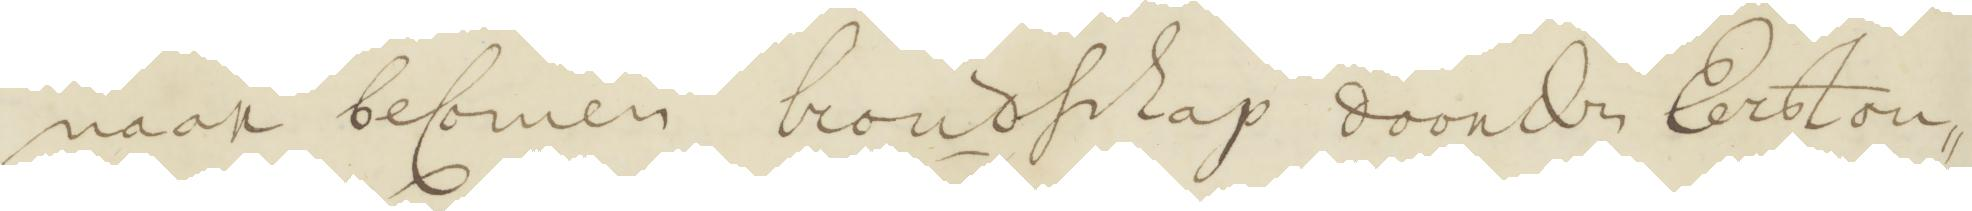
naar becomen kondschap door den Eerst on„
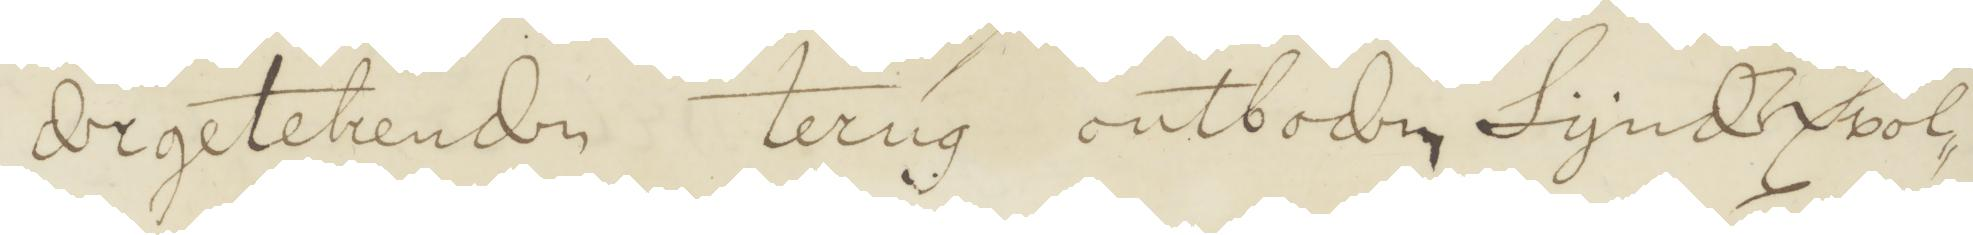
dergetekenden terug ontboden sijnde vervol„
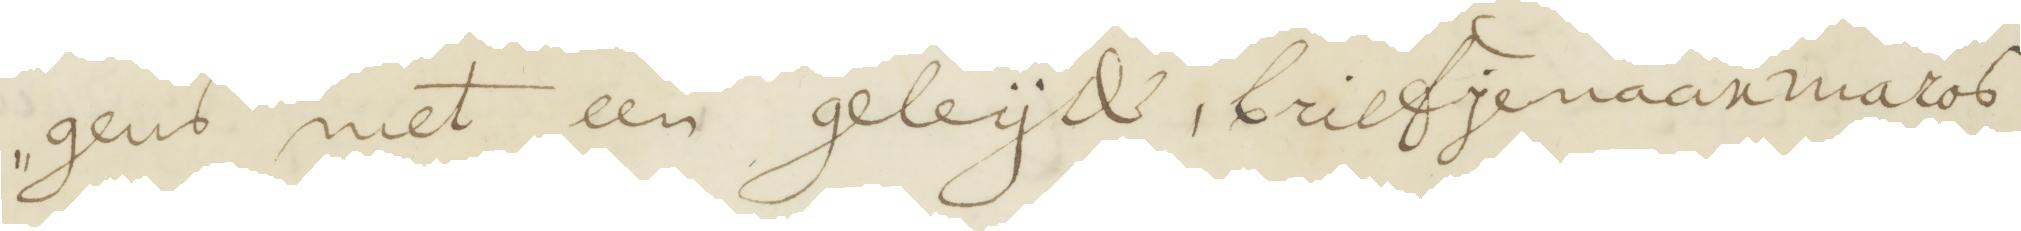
„gens met een geleijde, briefjenaar maros
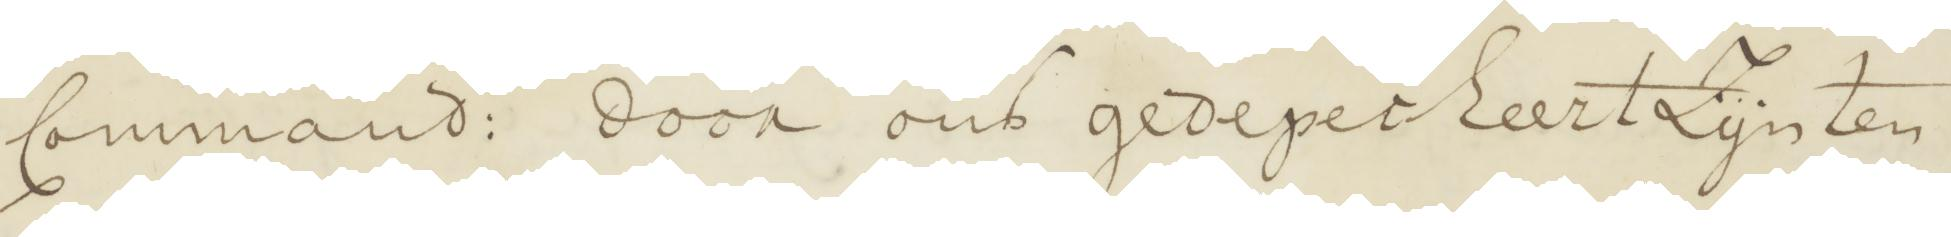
Command:t door ons gedepecheert zijn ten
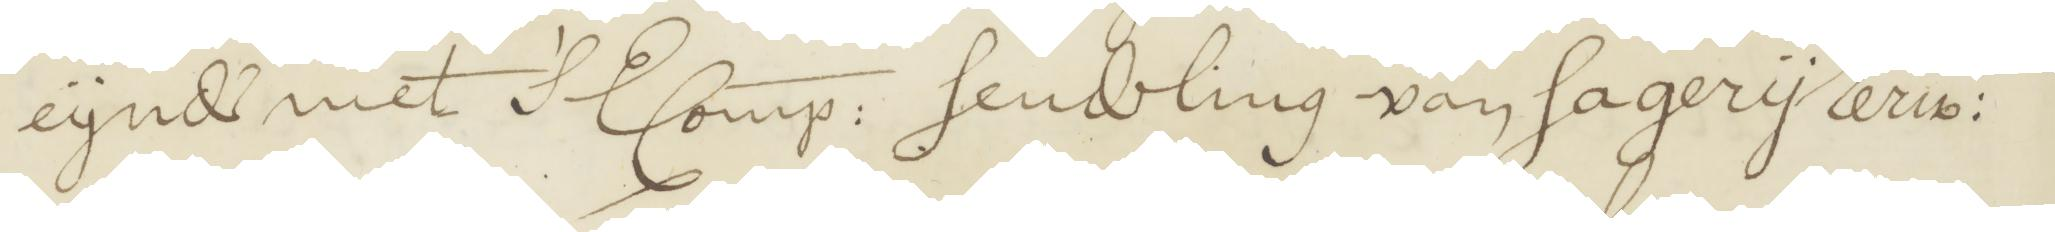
eijnde met ’s EComp: sendeling van sagerij herw:ts
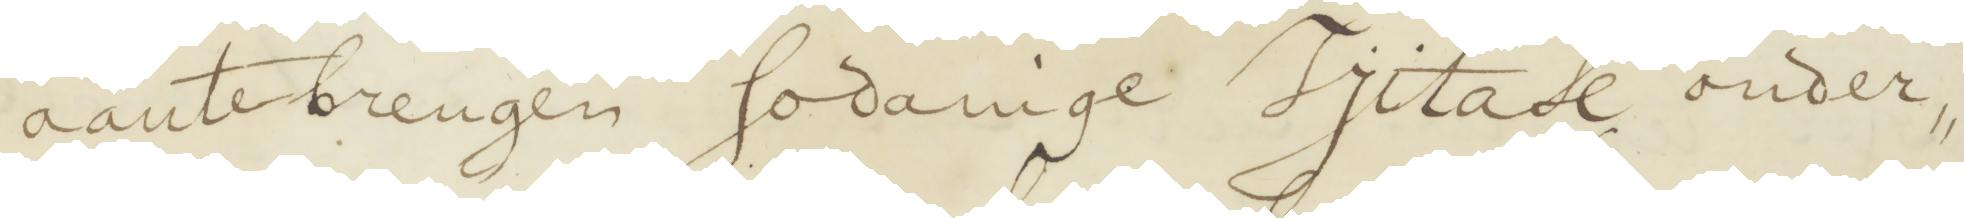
aan te brengen sodanige Tjitase onder„
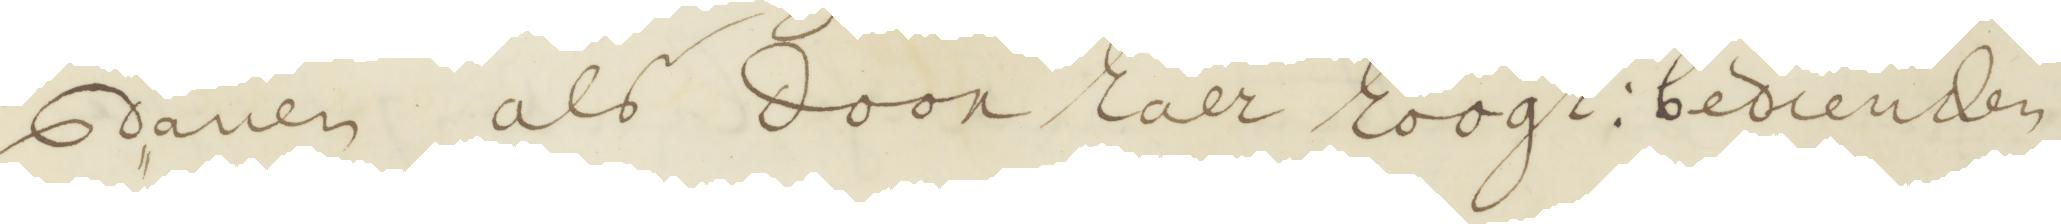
danen als door haer hoogh:ts bedienden
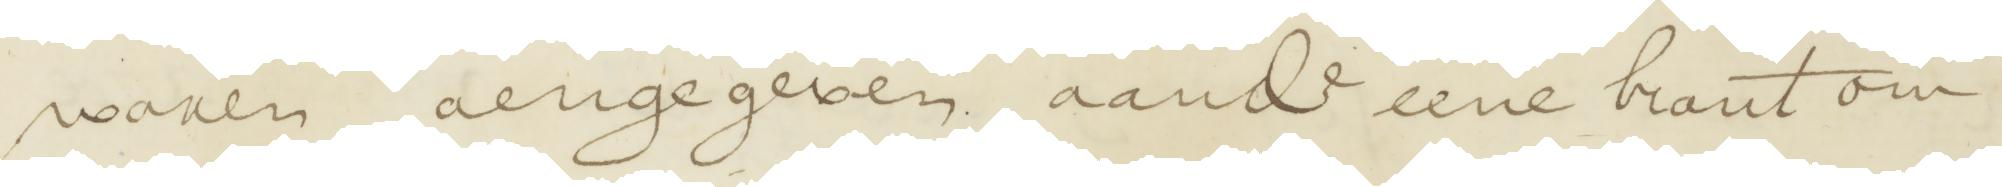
waren aengegeven aande eene kant om
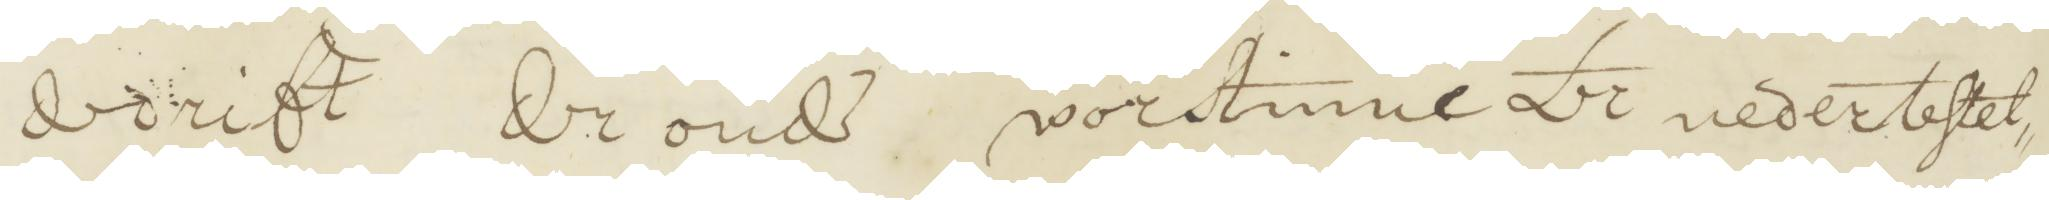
de drift der oude vorstinne ter neder testel„
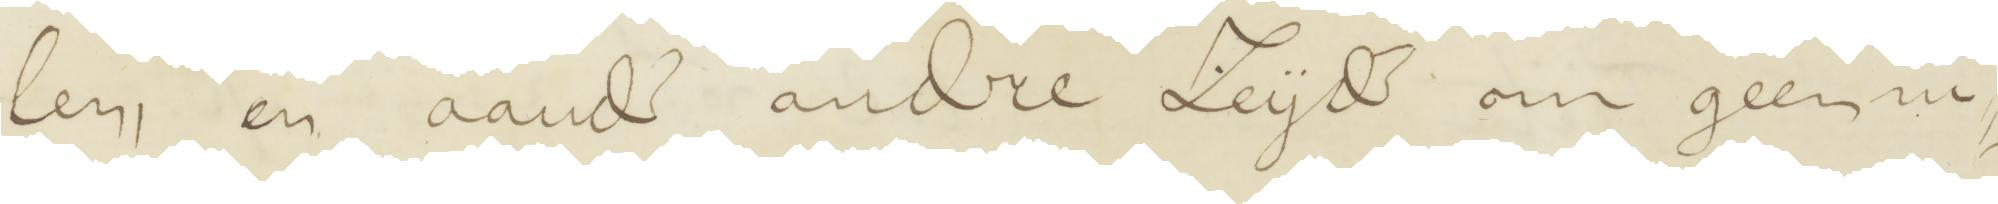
len, en aande andere zeijde om geen in„
